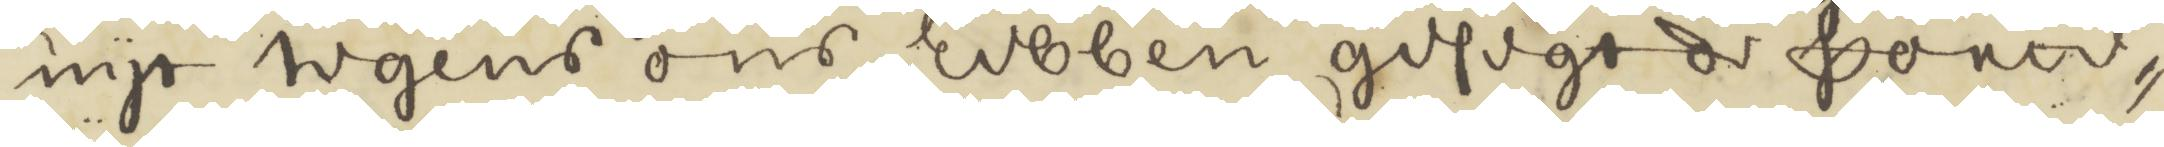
uijt tegens ons hebben gesegt de porce„
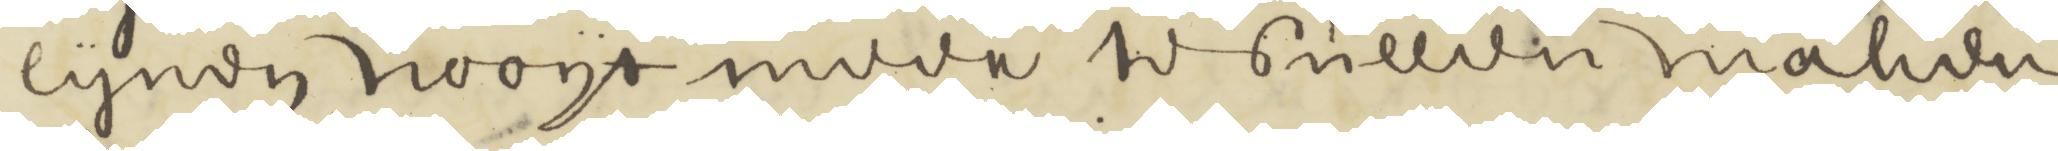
lijnen nooijt meer te sullen maken
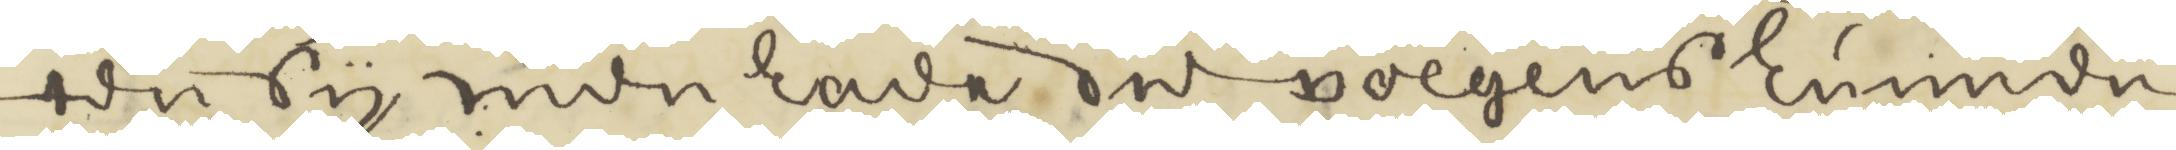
ten sij men haer die volgens hunnen
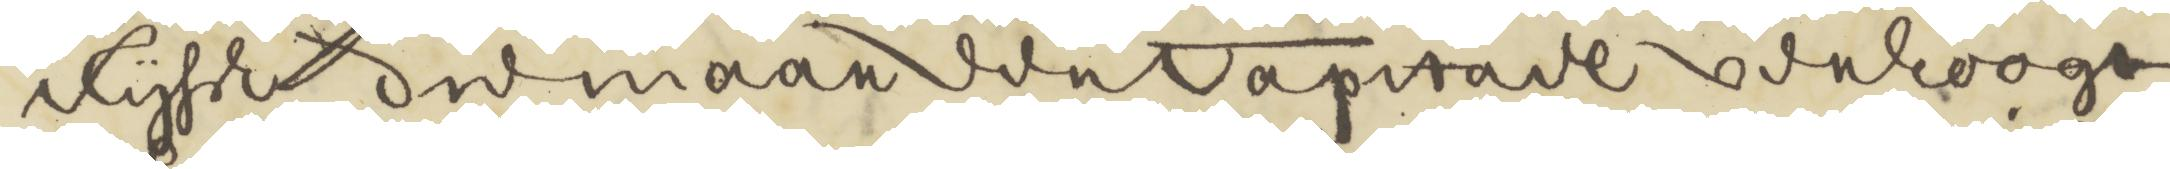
Eijsch die maar een Capitael verhoogt
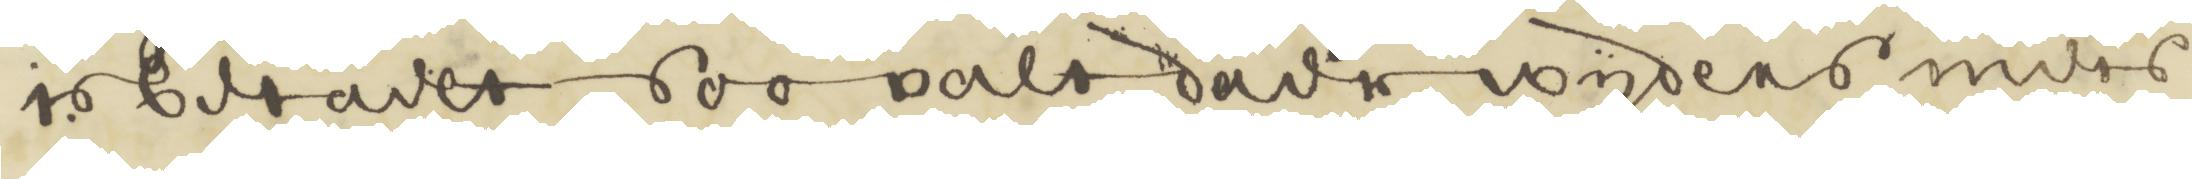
is betaelt soo valt daer wijders niets
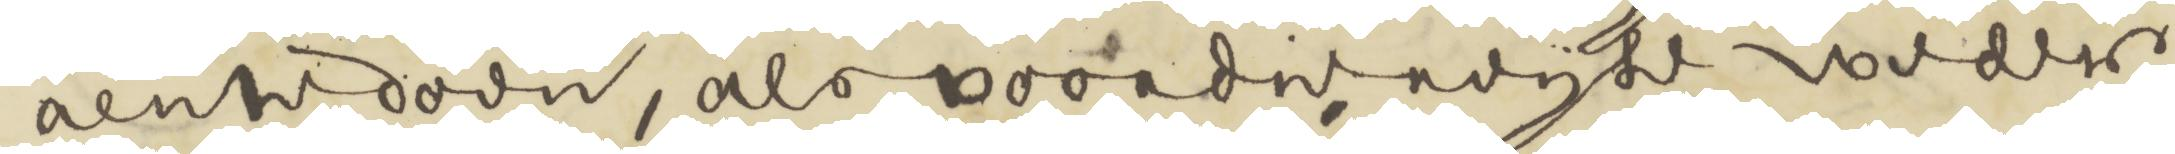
aentedoen, als voordiereijse weder
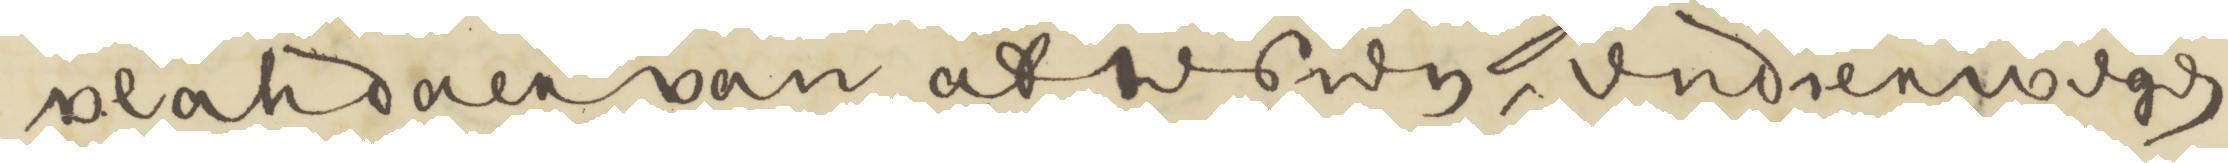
vlakdaervan aftesien, endierwegen
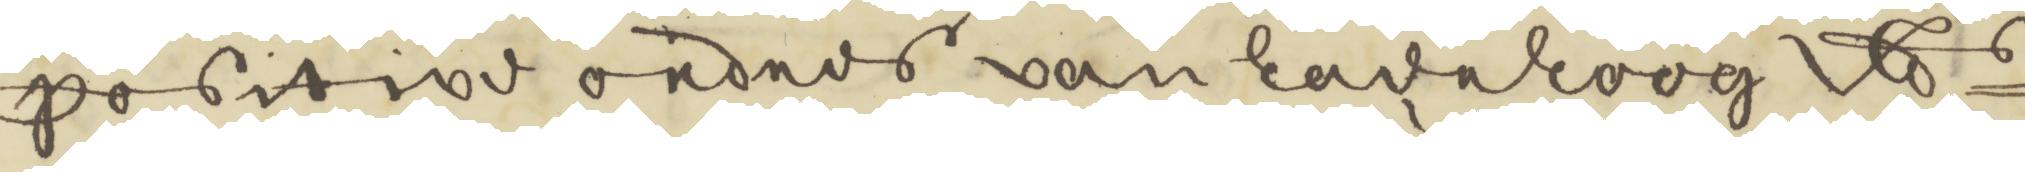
positive ordres van haerhoog Ed=s
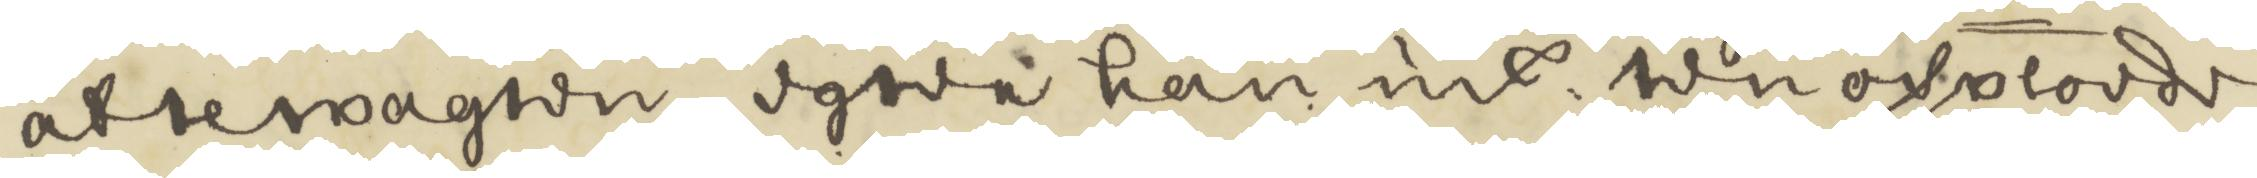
aftewagten, egter kan uE: ten overvloede
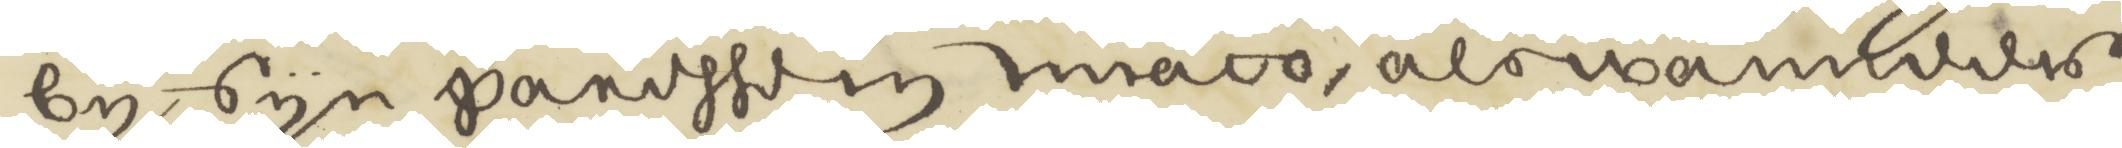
bij sijn paressein miaco, alswanneer
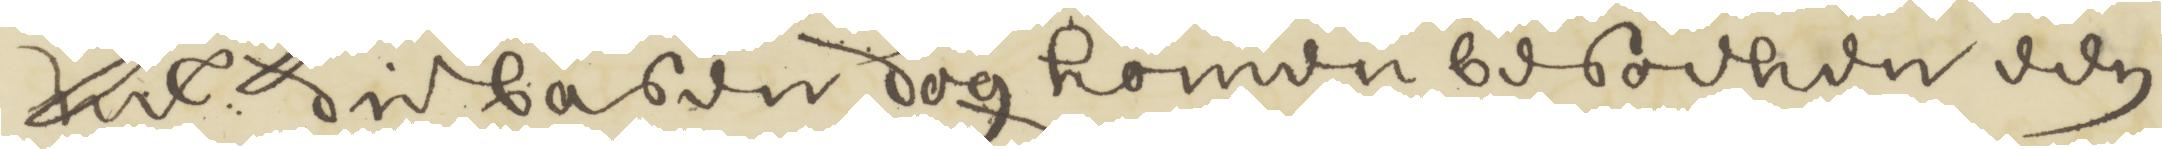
uE: diebasen dog komen besoeken een
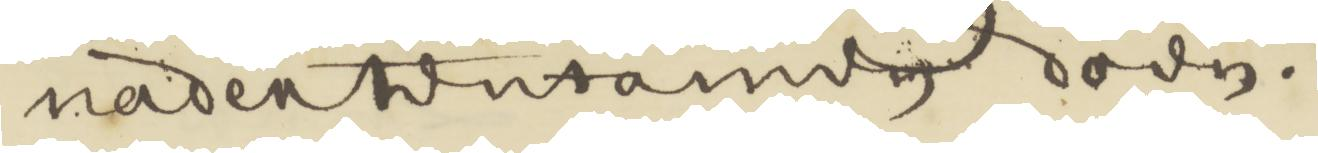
nadertentamen doen.
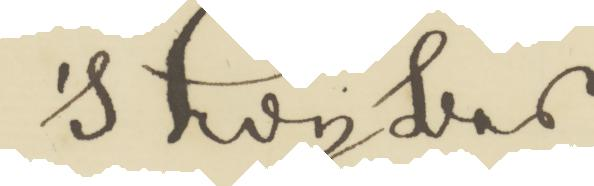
's keijsers
